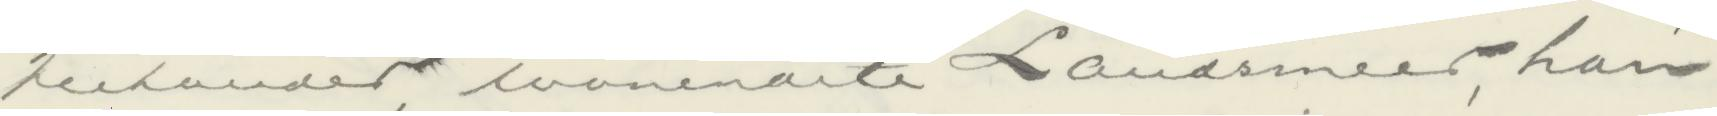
veehouder, wonende te Landsmeer, han
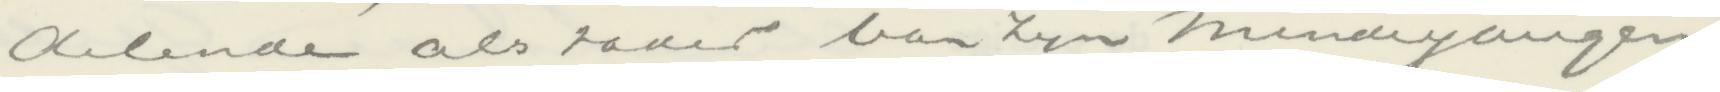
delende als vader van zyn minderjarigen
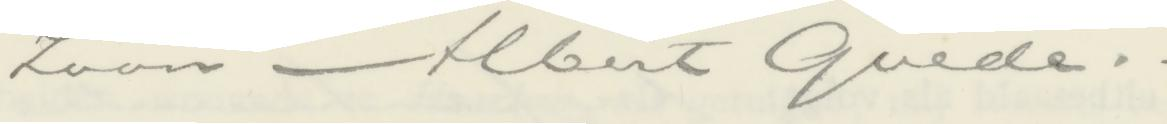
zoon Albert Goede.
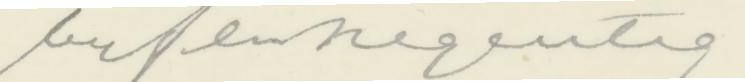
vyf en negentig
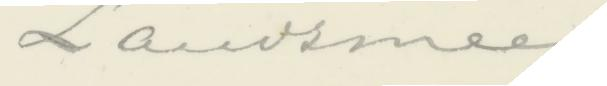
Landsmeer
